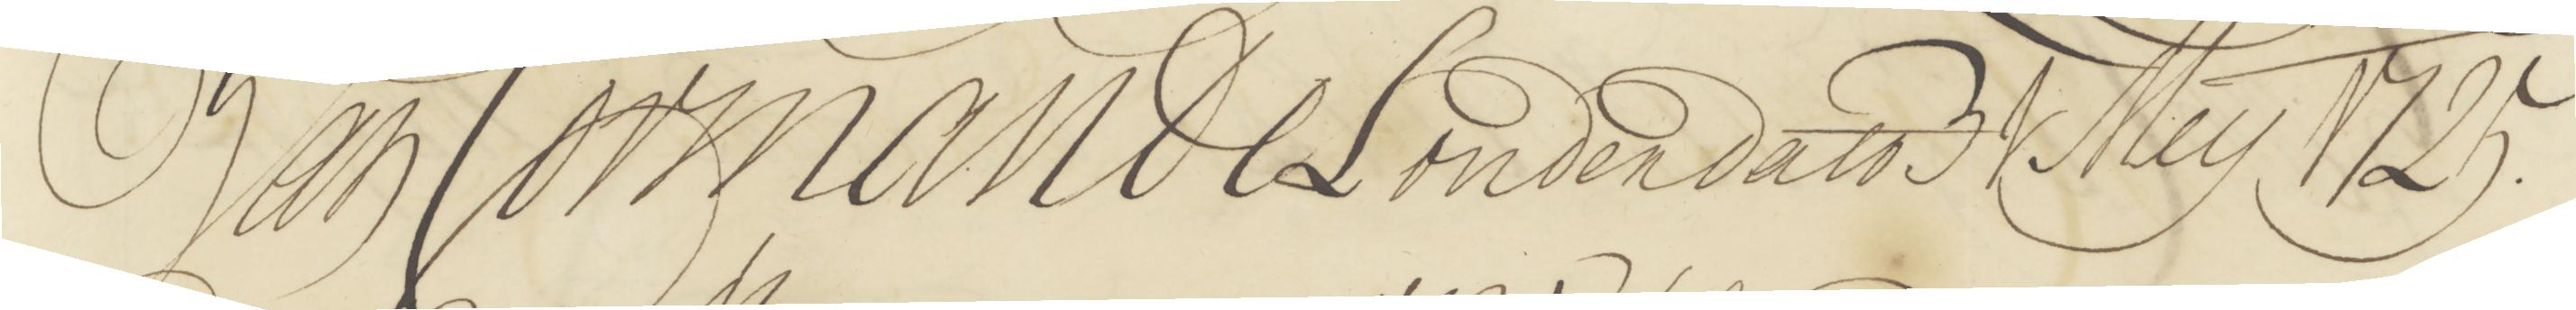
Van Cormandel onder dato 31 Mey 1725.
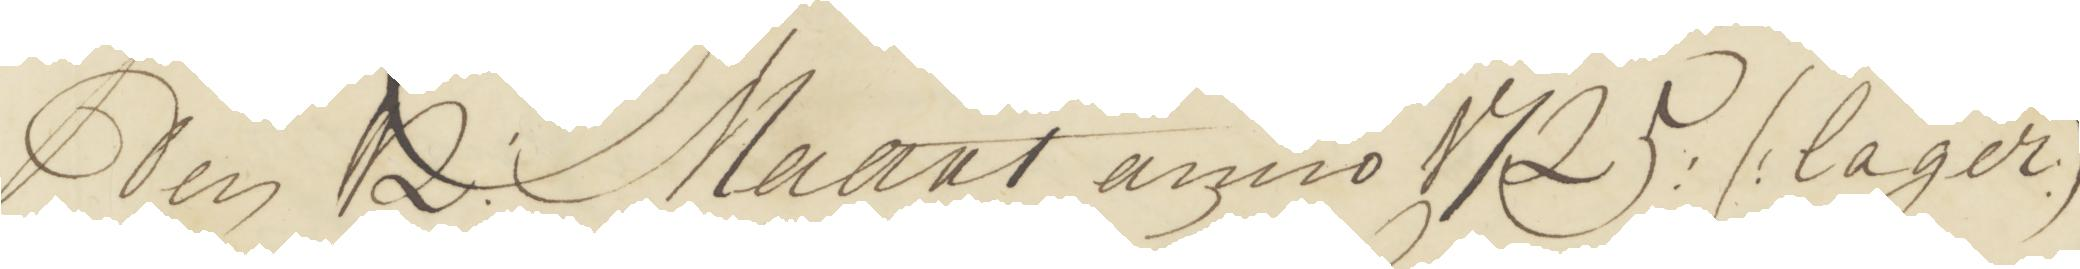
den 12: Maart anno 1725: (:lager:)
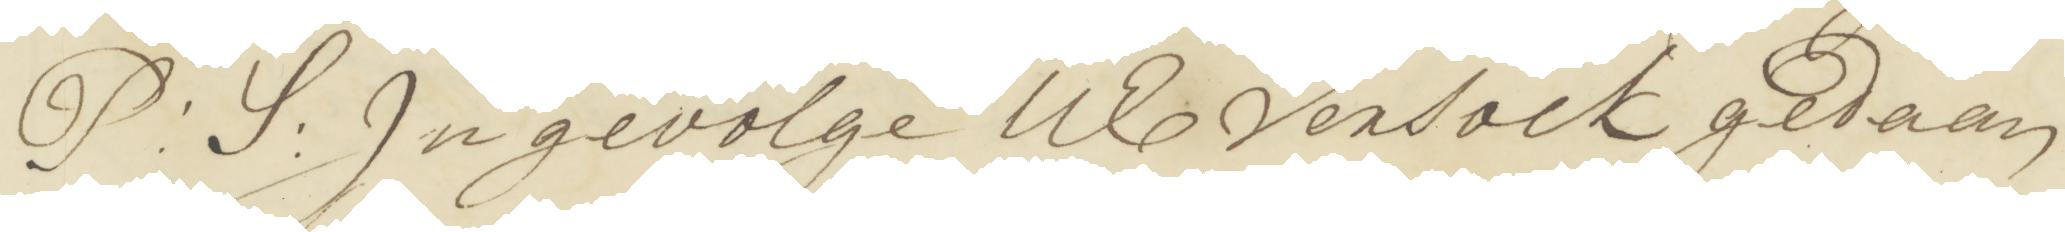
P: S: Jn gevolge UE versoek gedaan
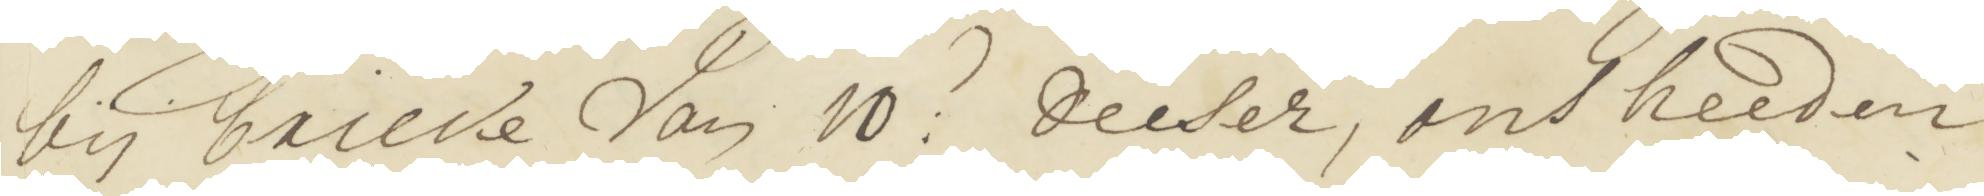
bij brieve van 10:' deeser, ons heeden
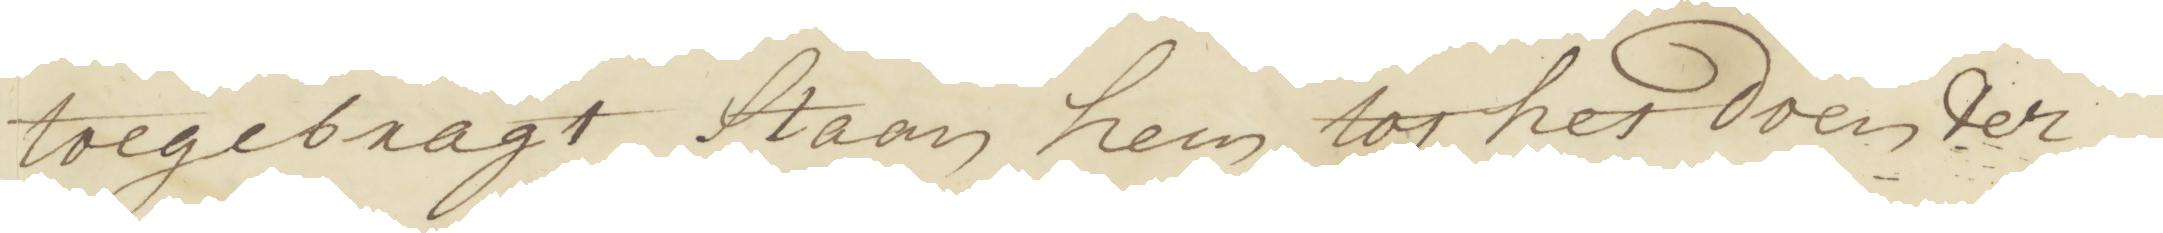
toegebragt, staan hem tot het doen ter
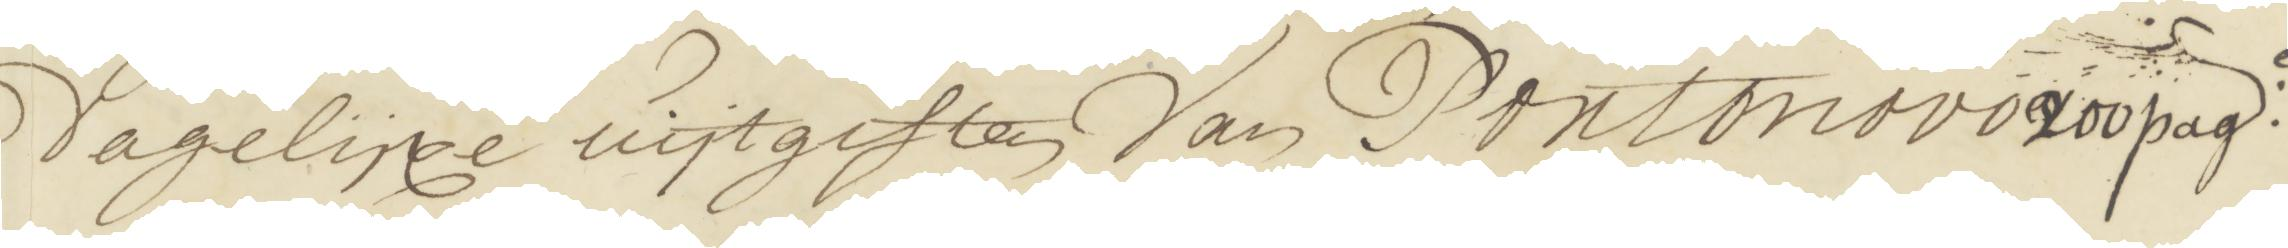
dagelijxe uijtgiften van Portonovo zoo pag:e
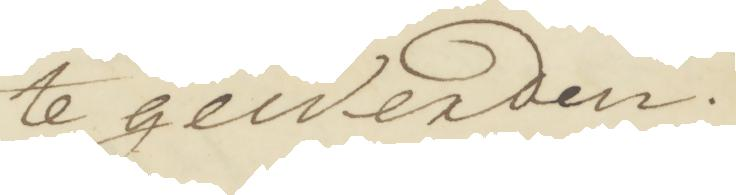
te gewerden.
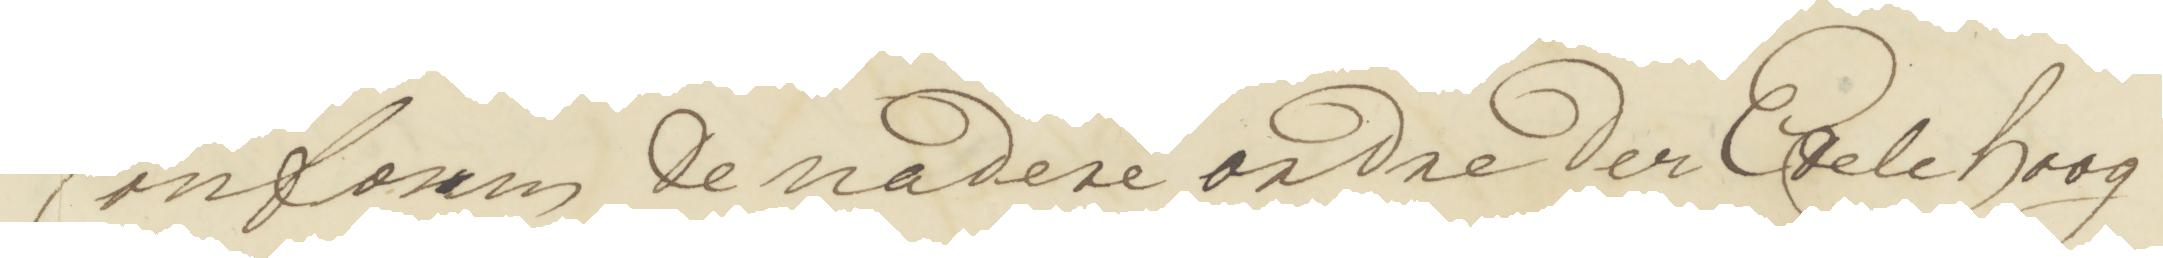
Conform de nadere ordre der Edele Hoog
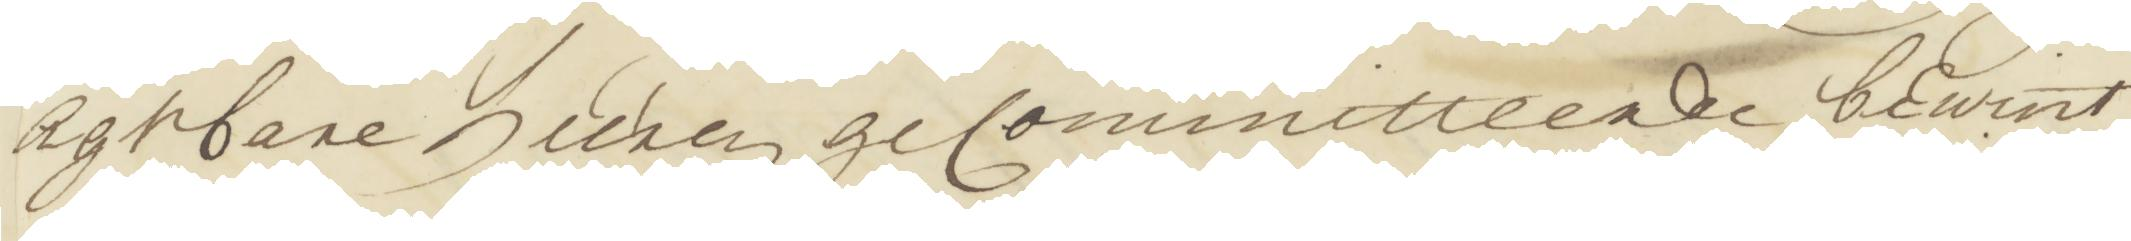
Agtbare Heeren gecommitteerde, bewint
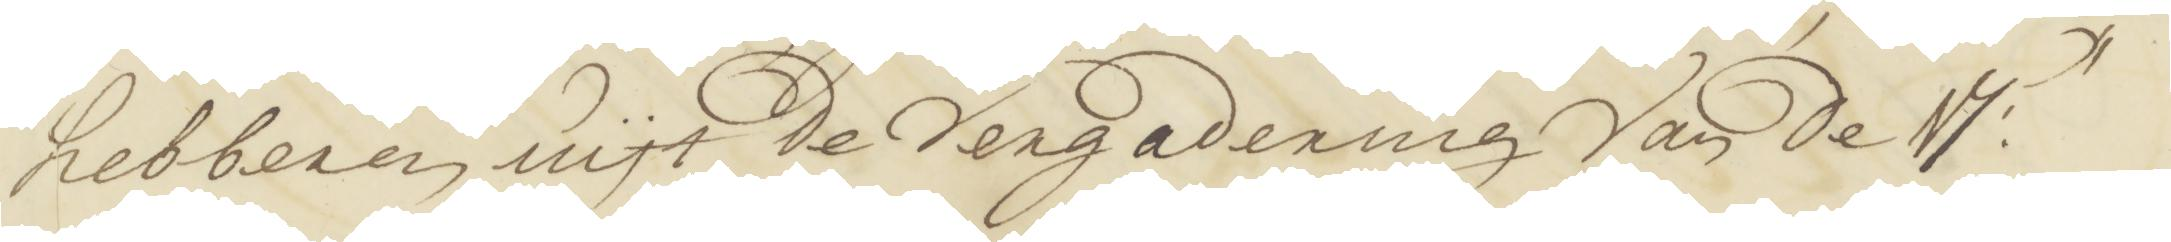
hebberen uijt de vergadering van de 17:'
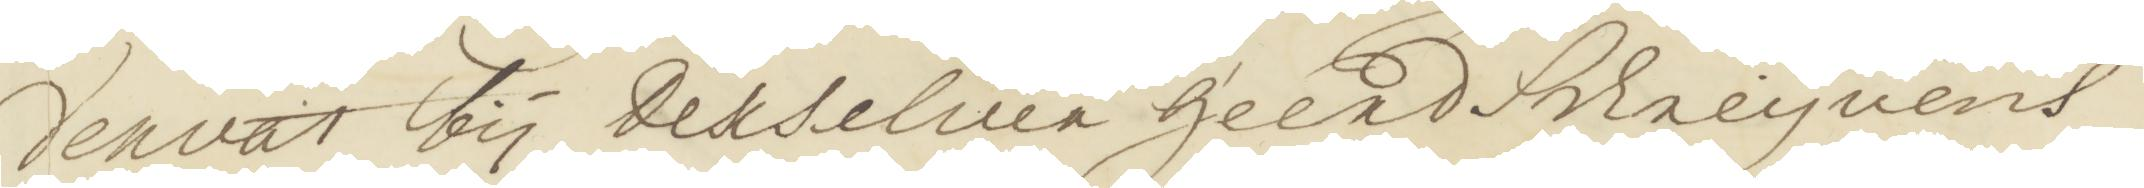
Vervat bij desselver g'eerd schreijvens
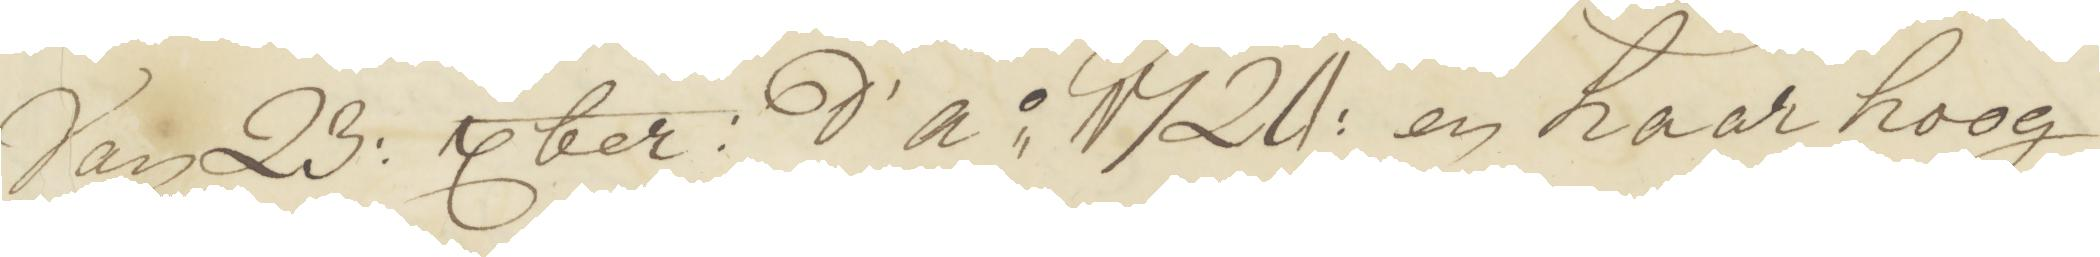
Van 23: xber: d’ a„o 1724: en haar hoog
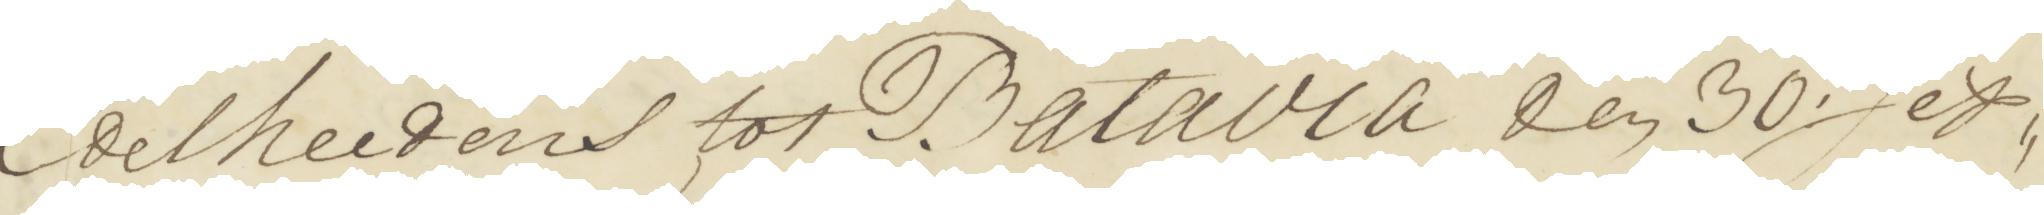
Edelheedens tot Batavia den 30:' sep„
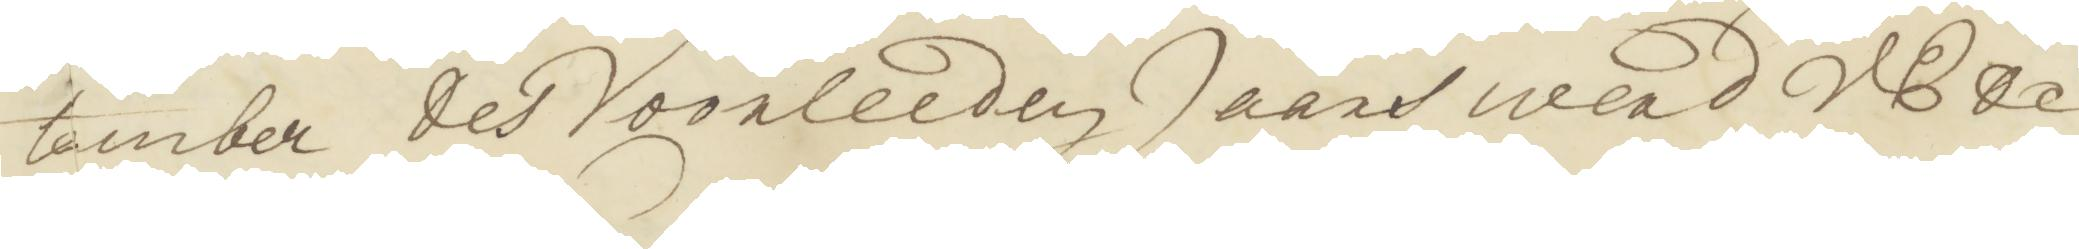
tember des Voorleeden Jaars werd VE de
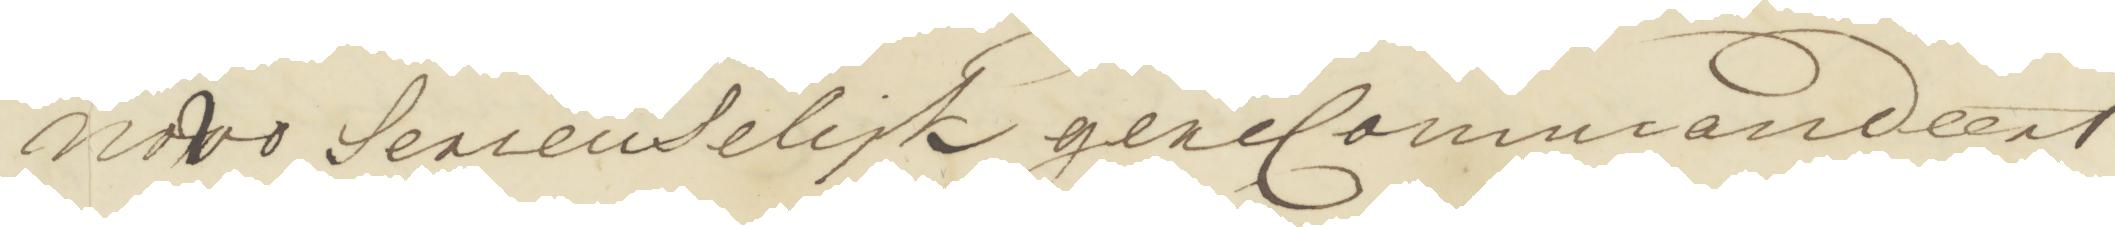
novo serieuselijk gerecommandeert
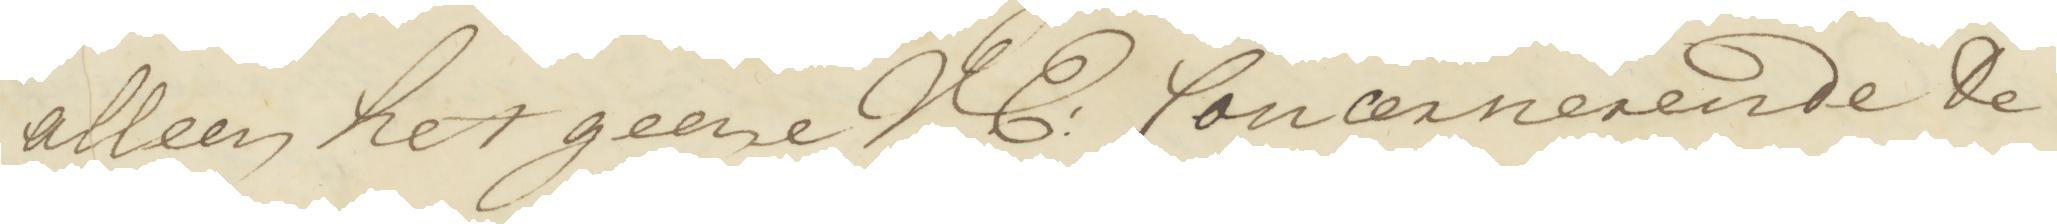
alleen het geene VE: Concernerende de
